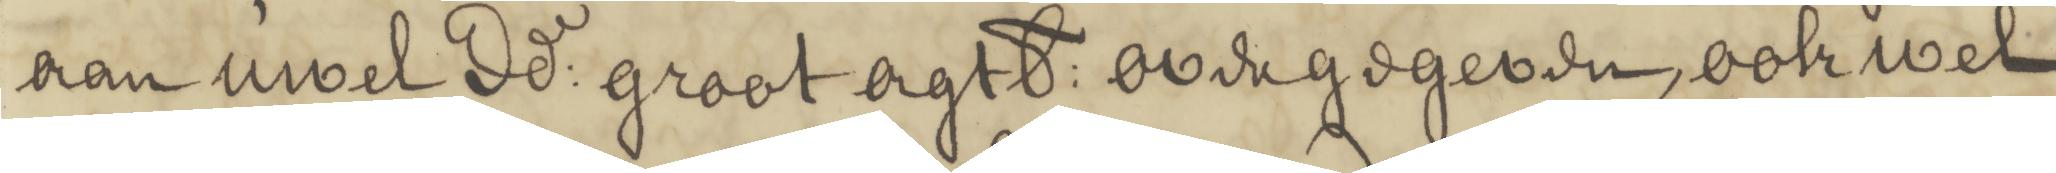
aan uwel Ed: groot agtb: overgegeven, ook wel
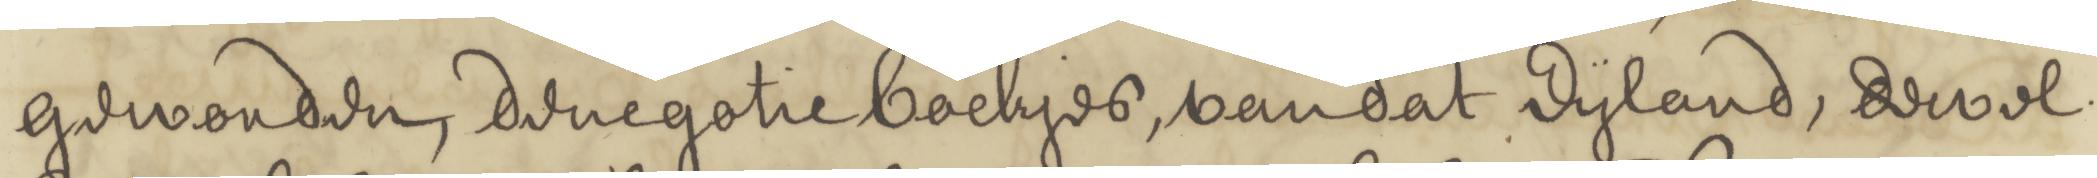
geworden, denegotie boekjes, van dat Eijland, dewel.
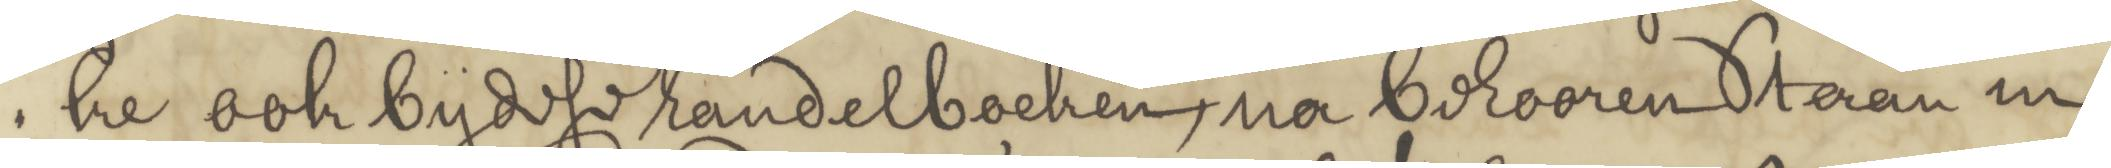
„ke ook bij dese handelboeken, na behooren staan in
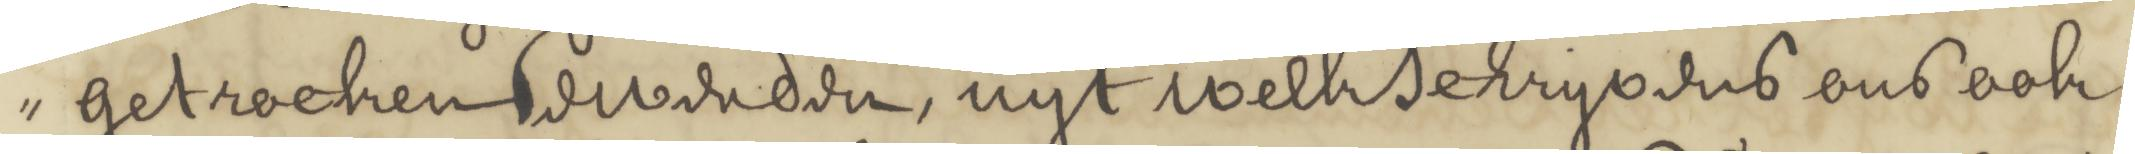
„getrocken tewerden, uijt welk schrijvens ons ook
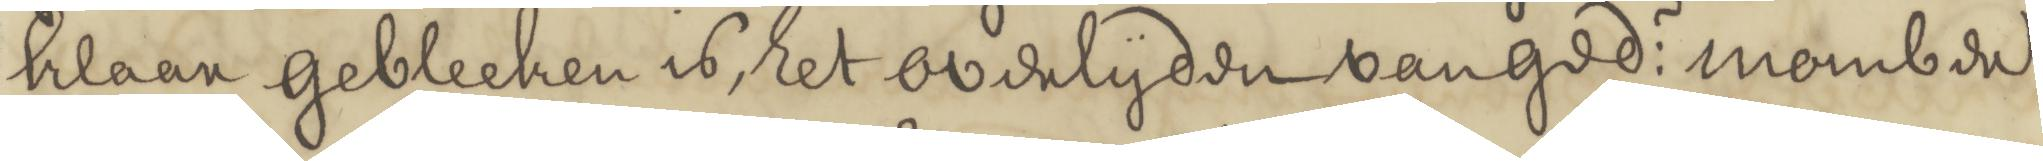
klaar gebleeken is, het overlijden van ged:' momber
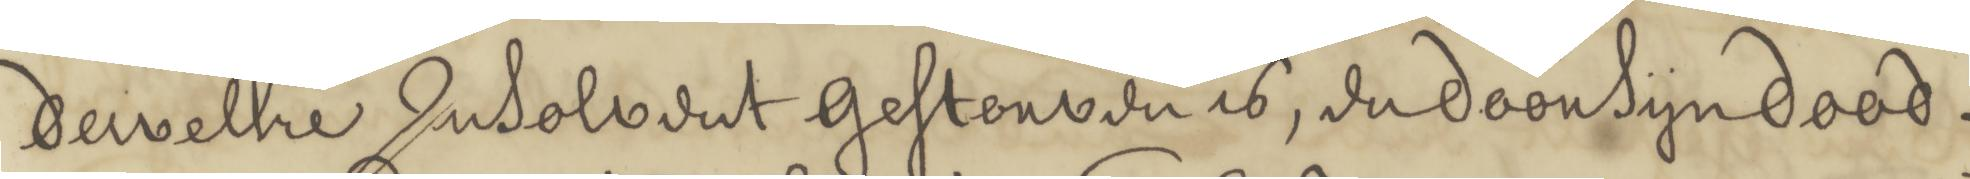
dewelke Jnsolvent gestorven is, en door sijn dood.
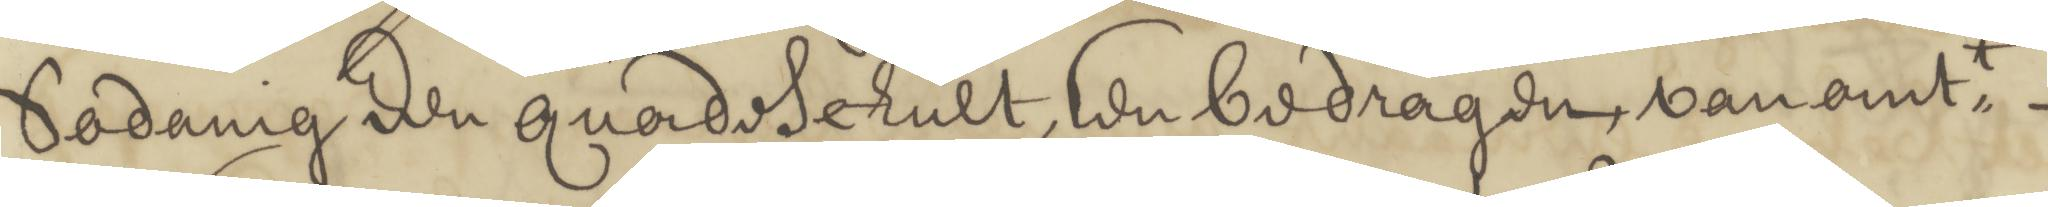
sodanig Een quadeschult, ten bedragen, van omt„t
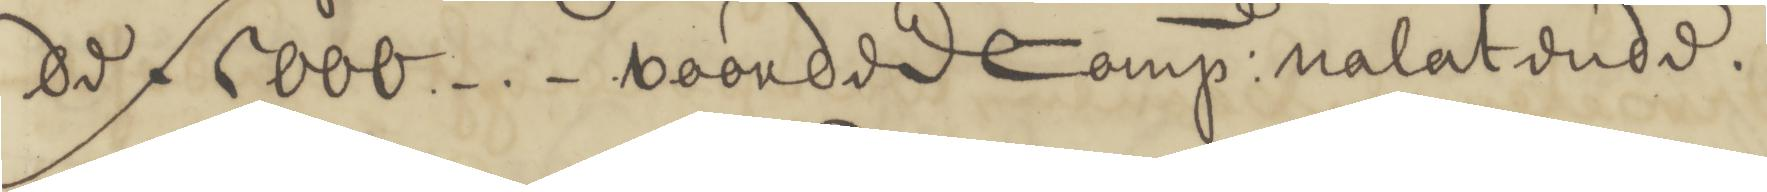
de ƒ5000.-.- voorde EComp:e nalatende.
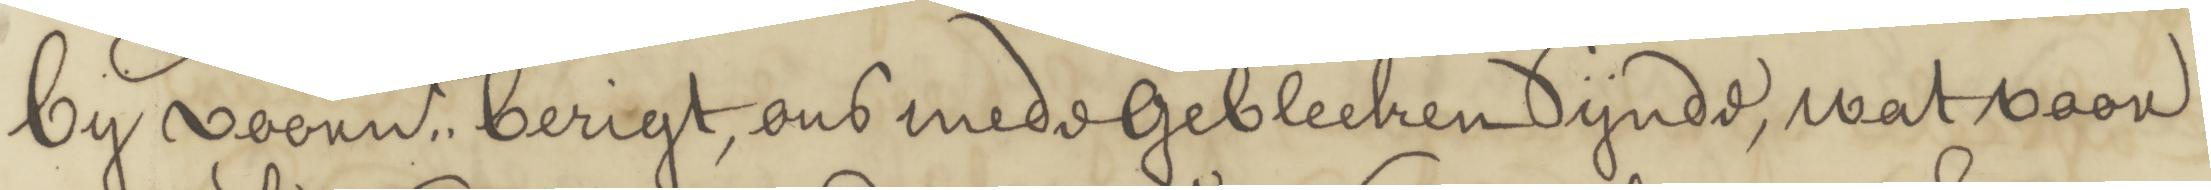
bij voorn„ berigt, ons mede gebleeken sijnde, wat voor
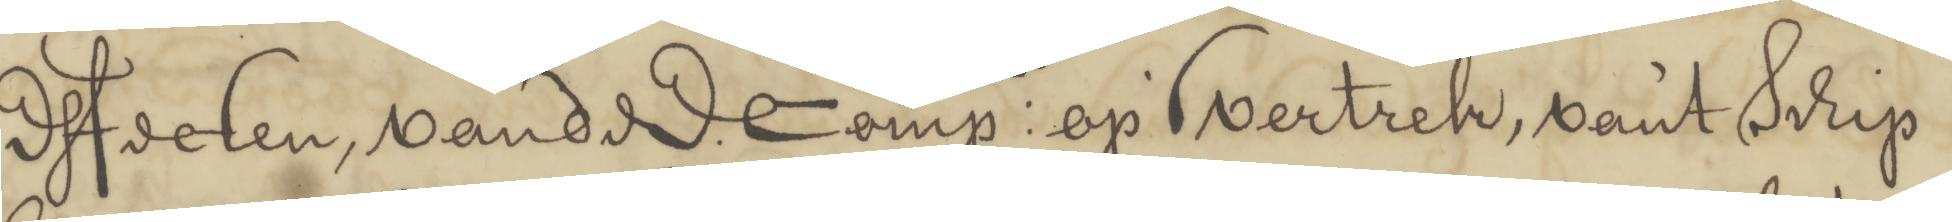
Effecten, vande E:Comp: op 't vertrek, van ’t schip
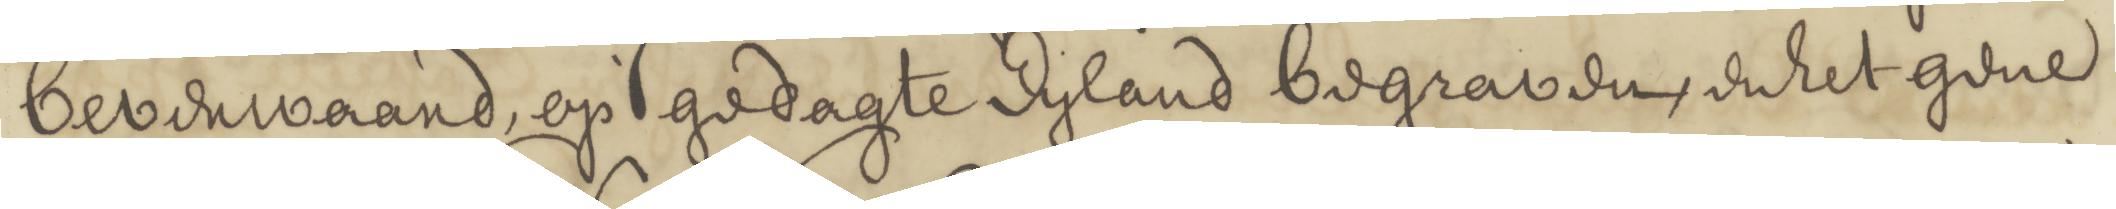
beverwaard, op ’t gedagte Eijland begraven, en het gene
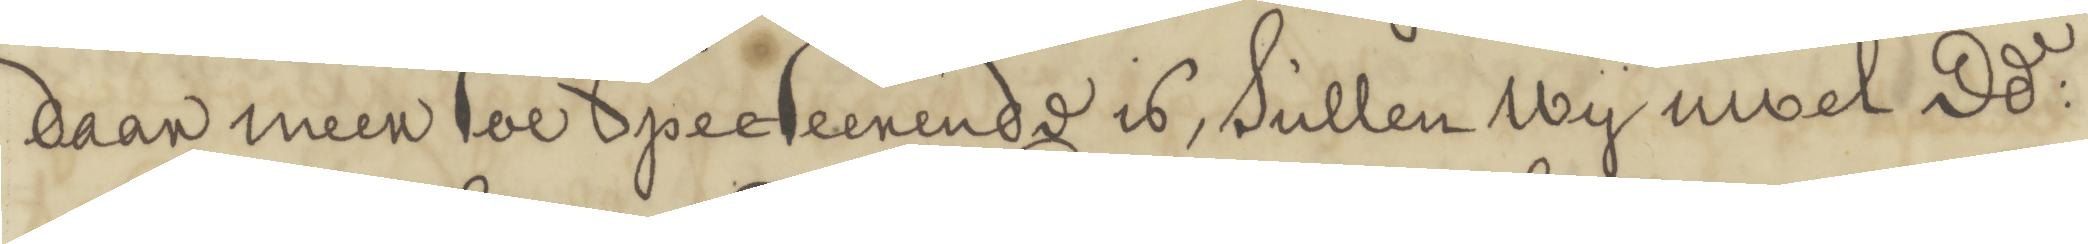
daar meer toe specteerende is, sullen wij uwel Ed:
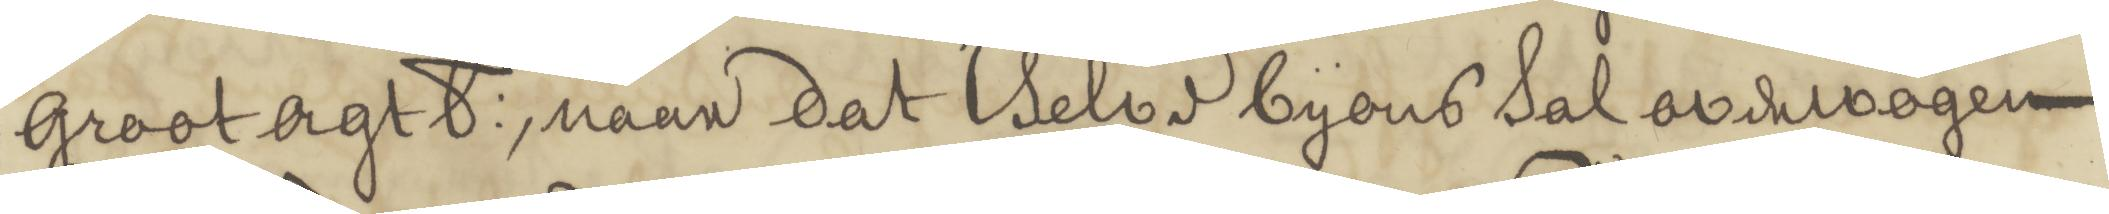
groot agtb:, naar dat 't selve bij ons sal overwogen
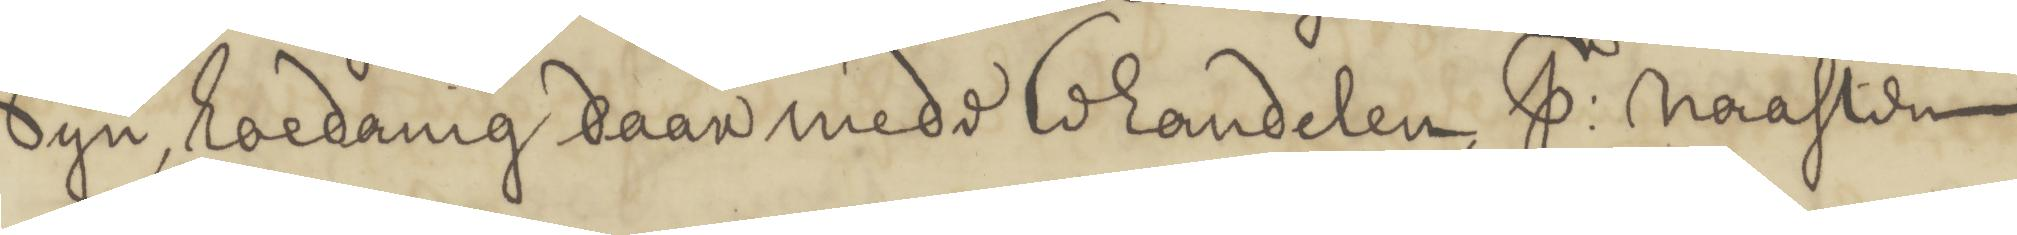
sijn, hoedanig daar mede te handelen, p:r naasten
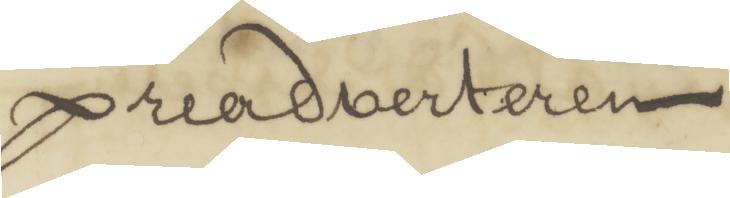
preadverteren
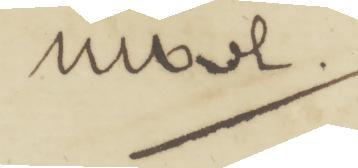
uwel.
